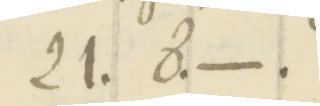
21. 8.—.
